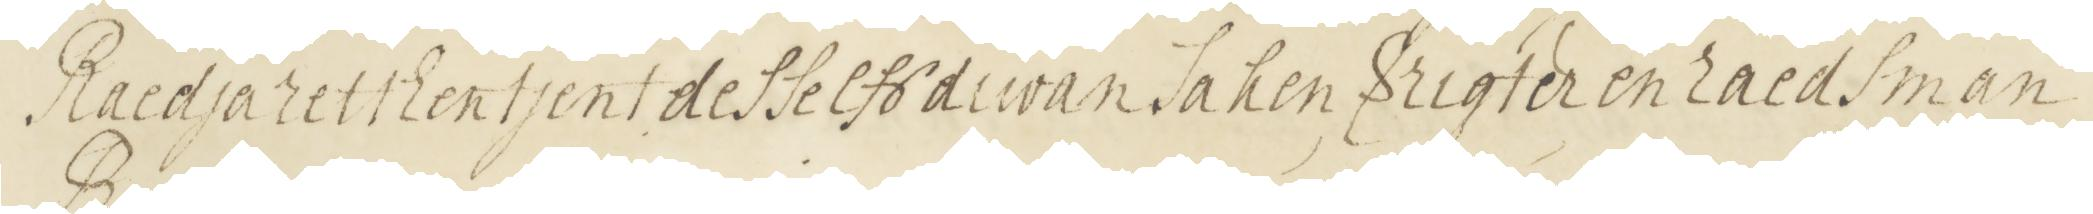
Raedja retthentjent desselfs diwan saken verrigter en raedsman
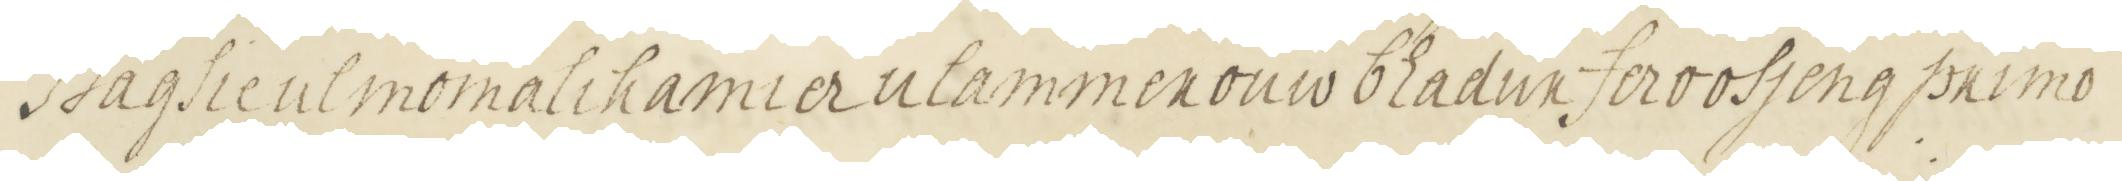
Bagsieul momalckamier ulammerouw bhadur feroosjeng primo
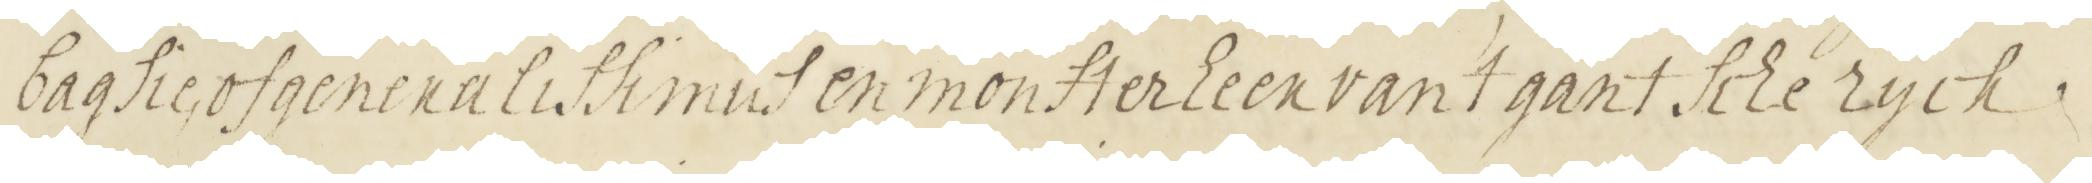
bagsie, of generalissimus en monsterheer van ’t gantsche rijck
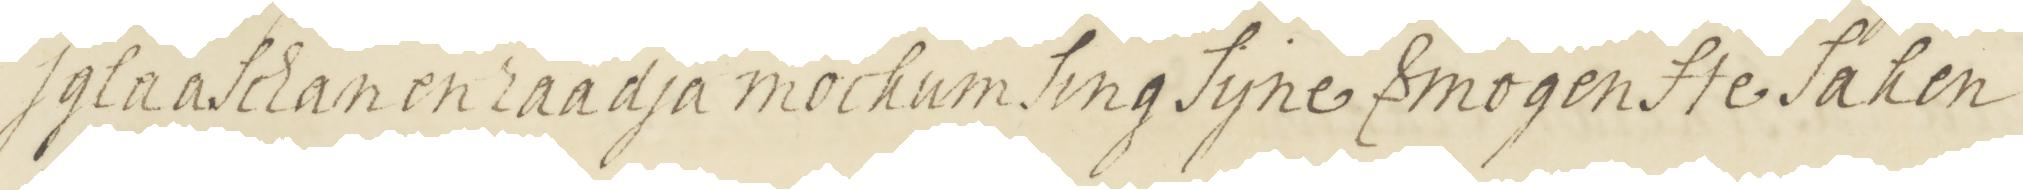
Jglaaschan en raadja mockum sing sijne vermogenste saken
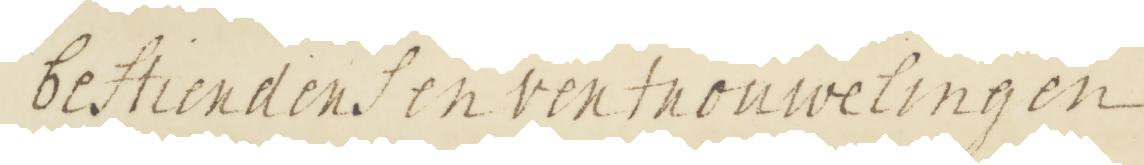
bestierdens en vertrouwelingen
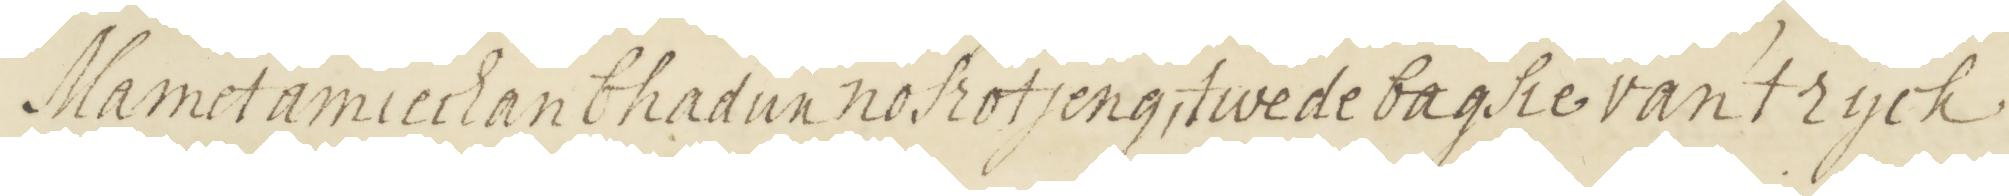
Mametamiechan bhadur no kotjeng, twede bagsie van ’t rijck
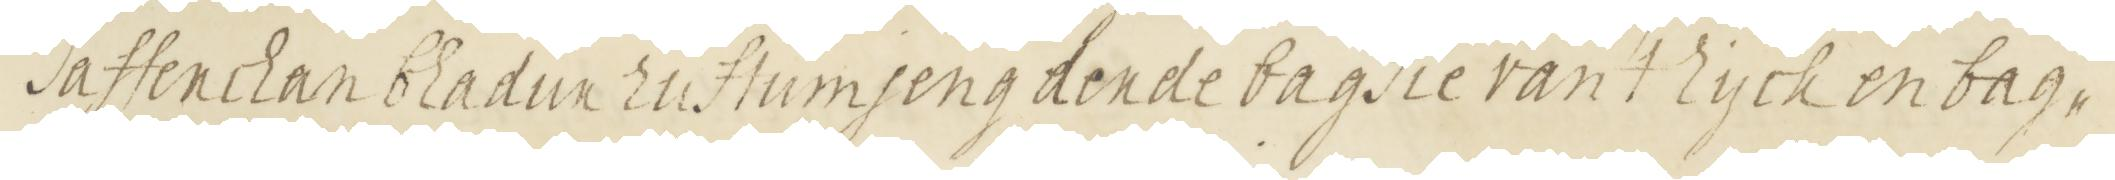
Safferchan bhadur rustumjeng derde bagsie van ’t Rijck en bag„
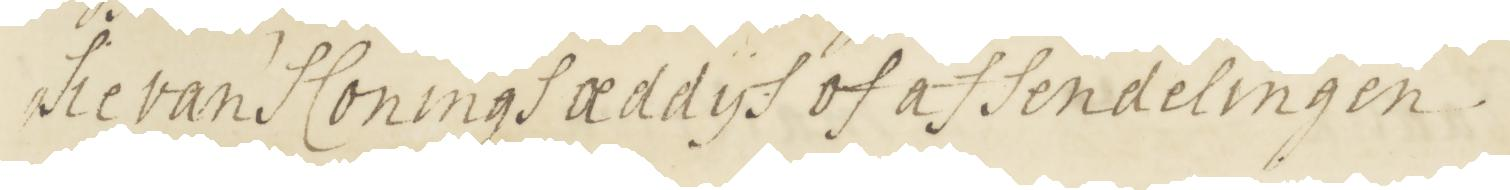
„sie van 'sConings oeddijs of afsendelingen
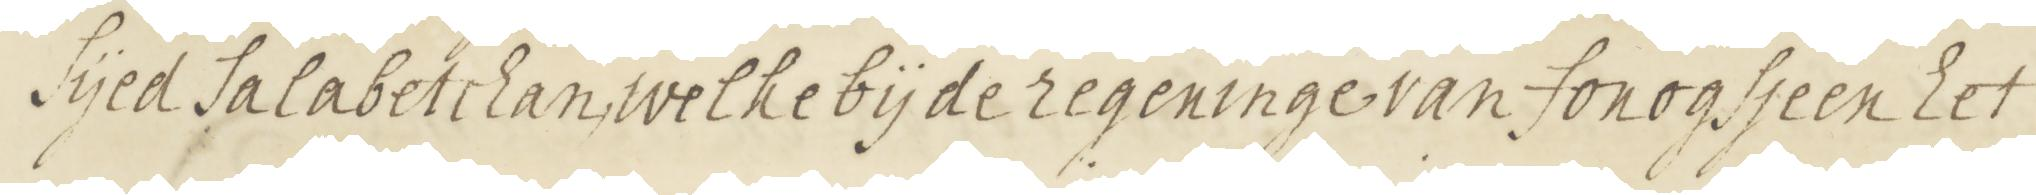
sijed salabetchan, welke bij de regeringe van forogsjeer het
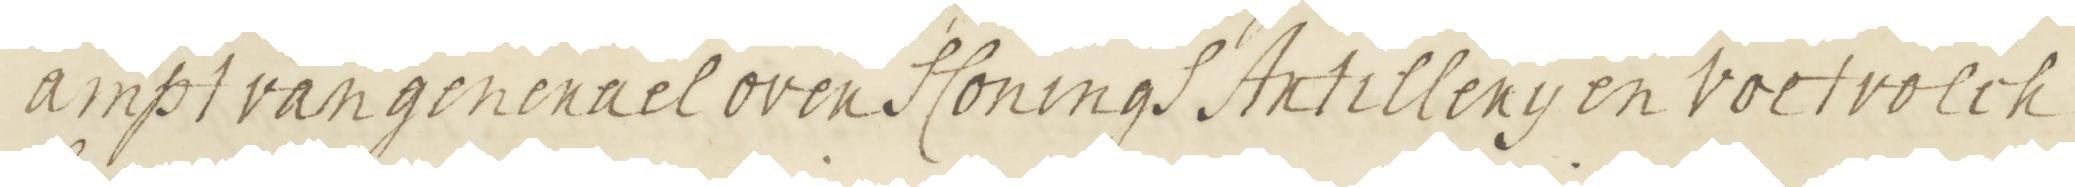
ampt van generael over 'sConings Artillerij en Voetvolck
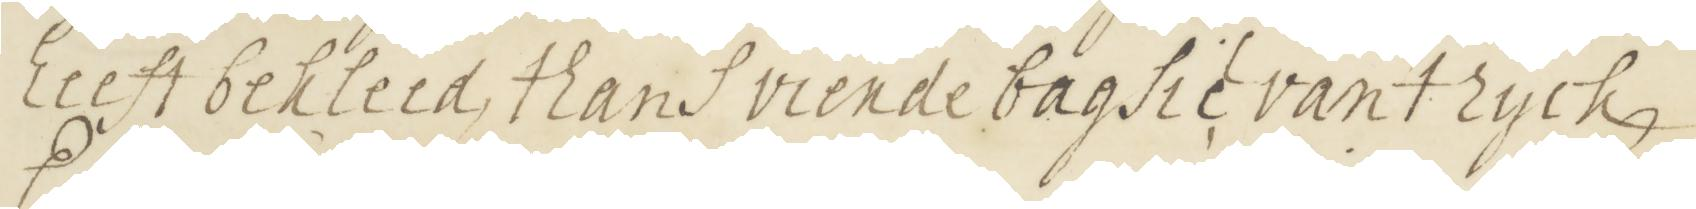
heeft bekleed, thans vierde bagsie van ’t rijck
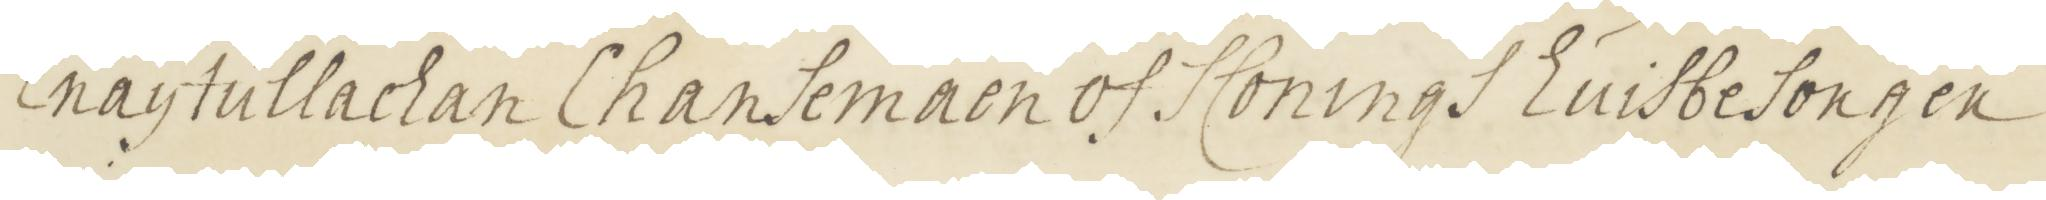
Enaijtullachan Chansemaen of 'sConings huisbesorger
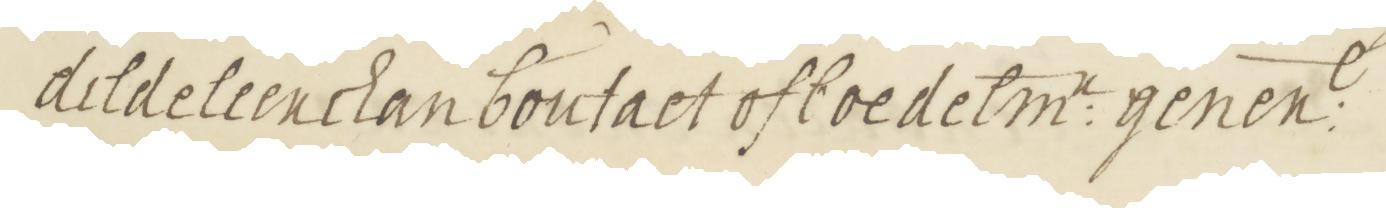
dildeleerchan boutact of boedelm:r gener:l
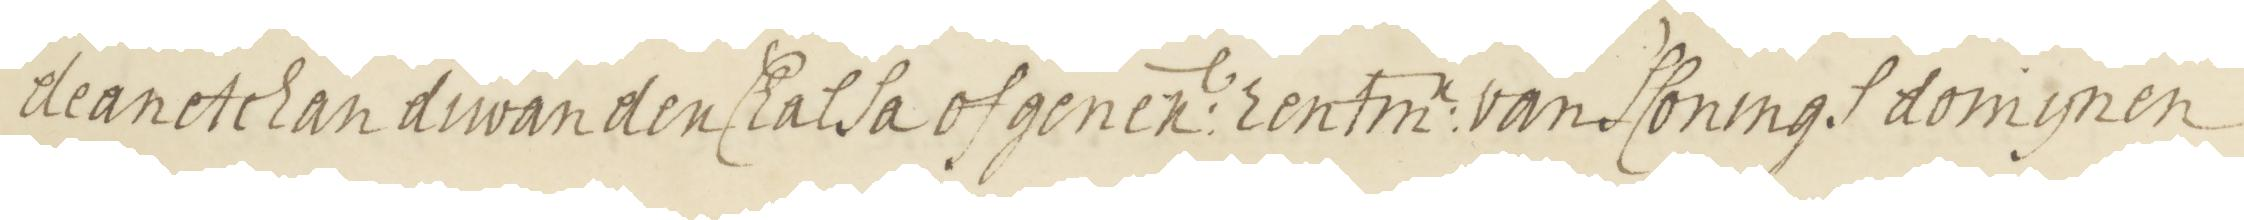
deanetchan diwan den Chalsa of gener:l rentm:r van 'sConings domijnen
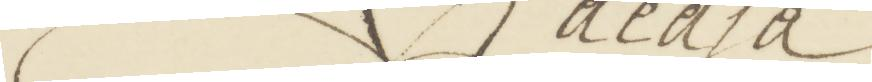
Raedja
